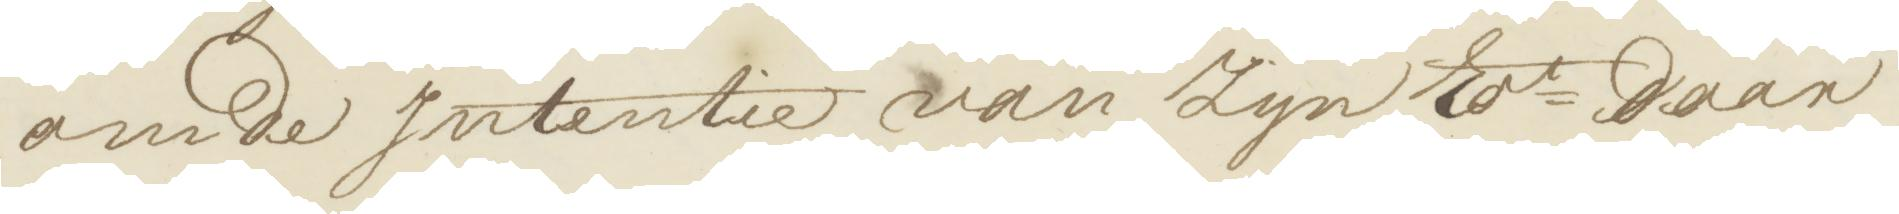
om de Jntentie van zijn ho=t daar
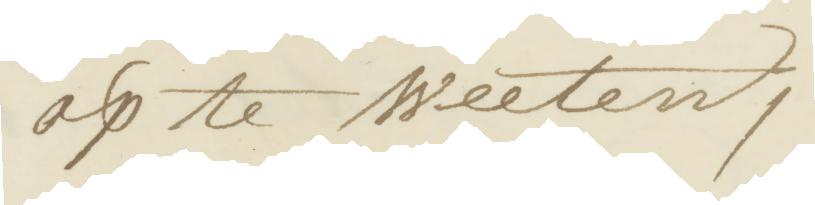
op te weeten,
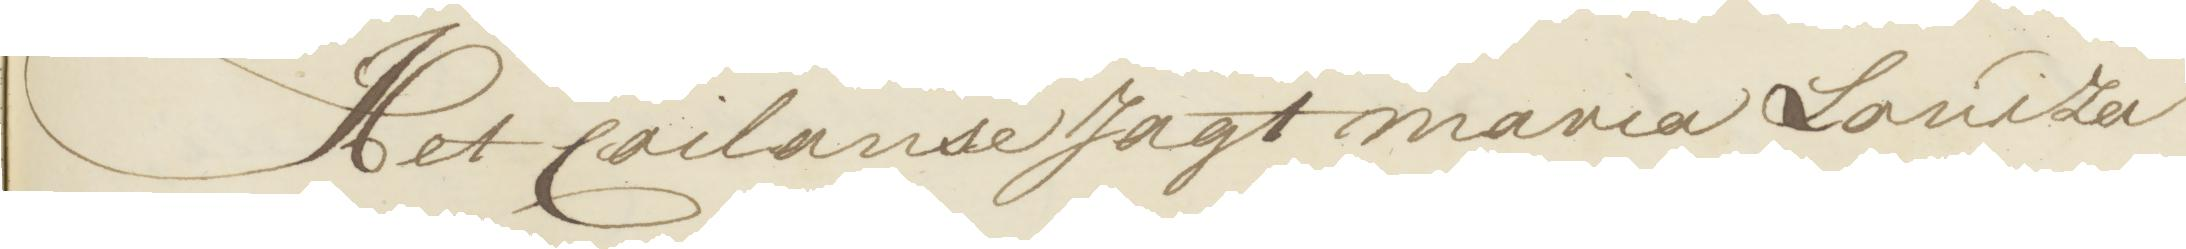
Het Cailanse Jagt maria Louiza
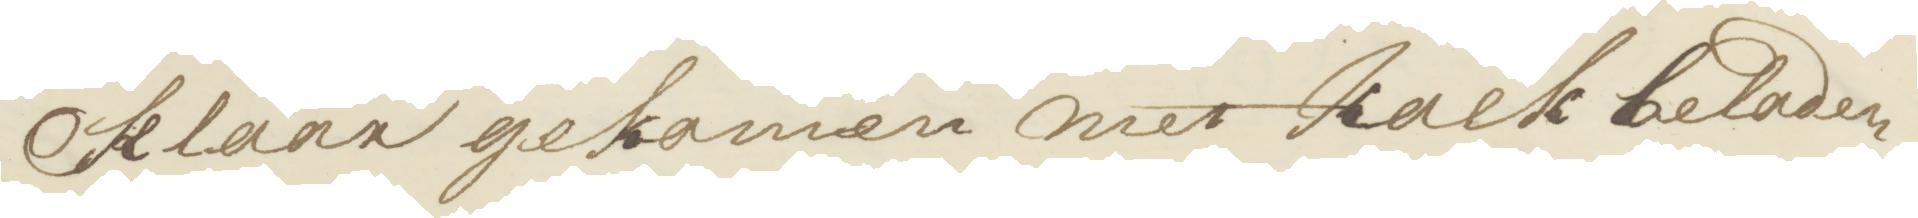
klaar gekomen met kalk beladen
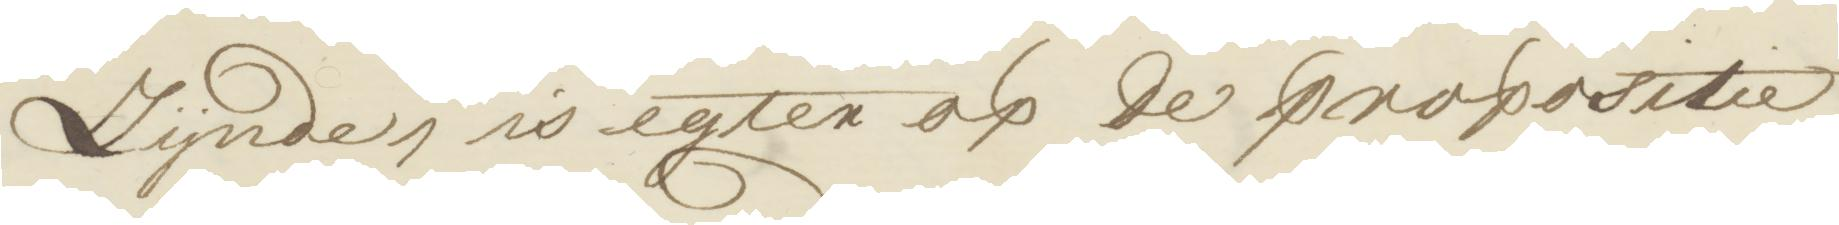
zijnde, is egter op de propositie
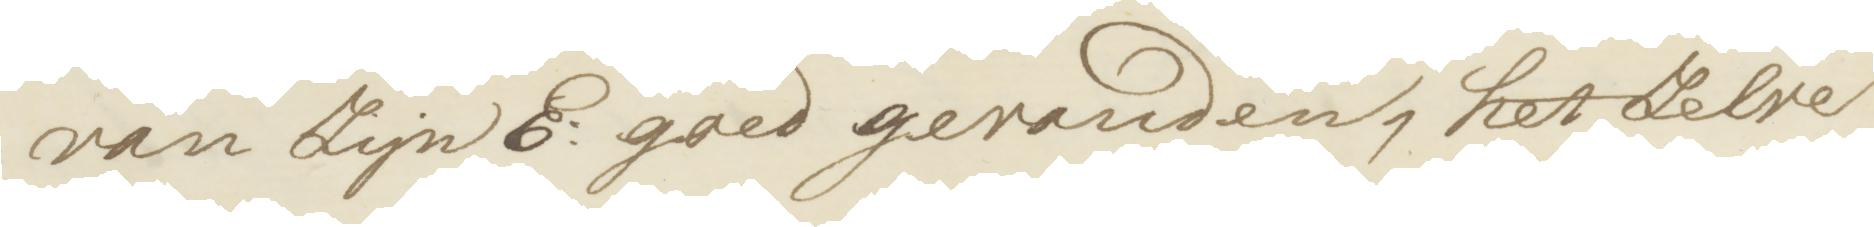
van zijn E: goed gevonden, het zelve
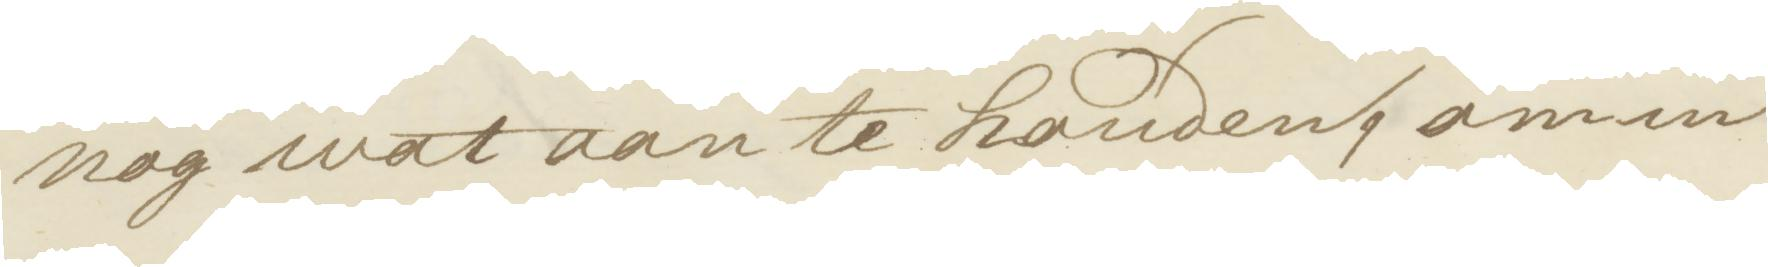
nog wat aan te houden, om in
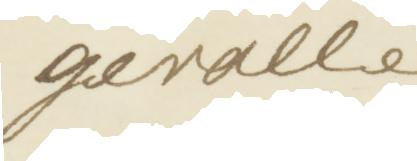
gevalle
